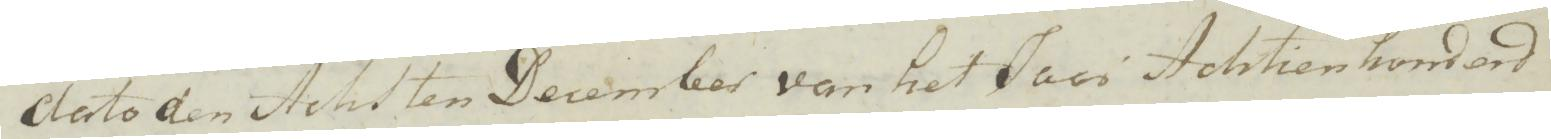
dato den Achsten December van het Jaar Achtien honderd
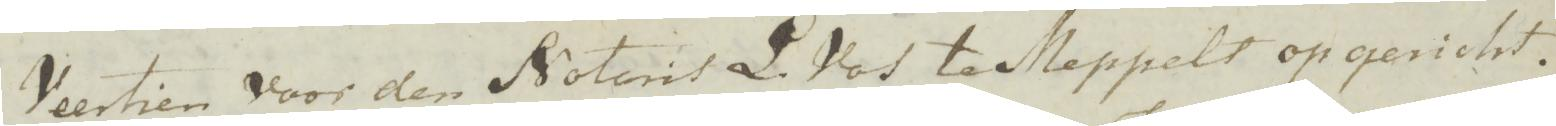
Veertien voor den Notaris L. Vos te Meppelt opgericht.
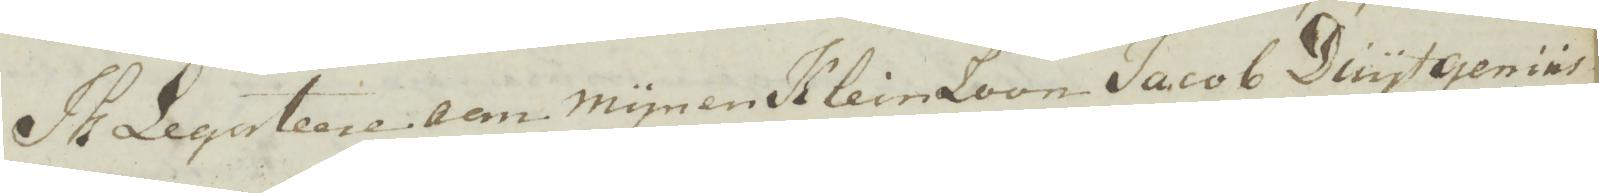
Ik Legateere aan mijnen Klein Zoon Jacob Duijtgenius
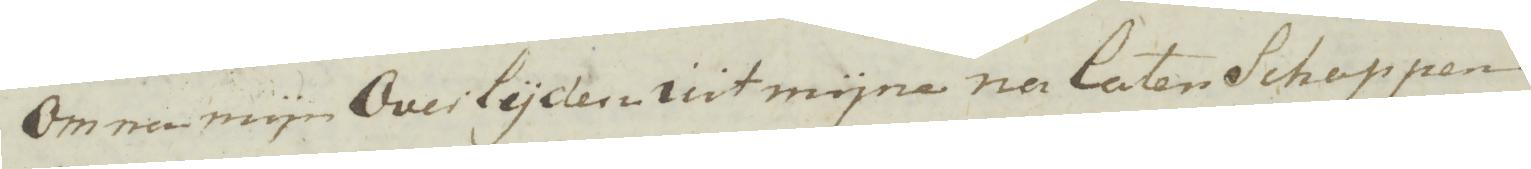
Om na mijn Overlijden uit mijne nalaten Schappen
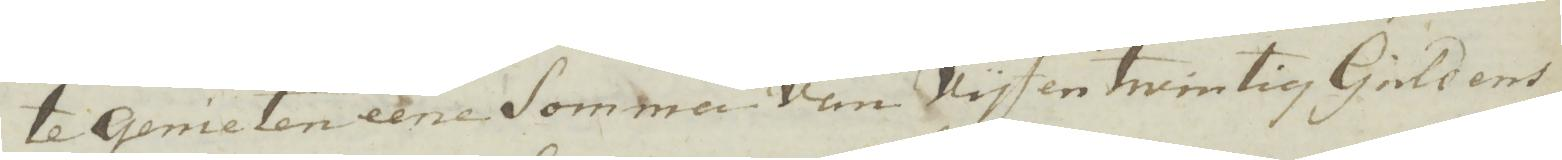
te genieten eene Somma van Vijf en twintig Guldens
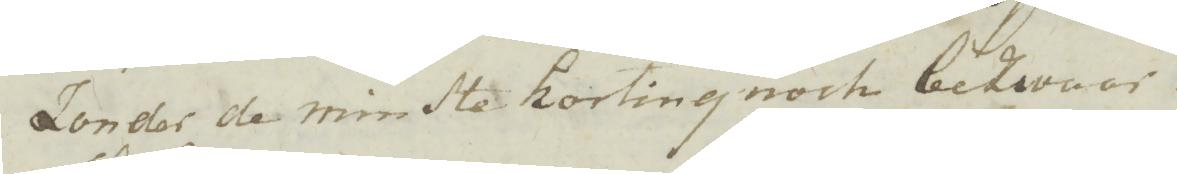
Zonder de minste korting noch bezwaar.
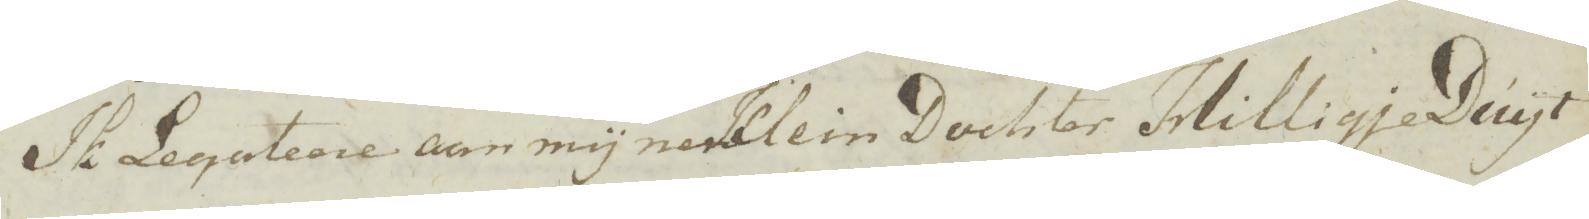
Ik Legateere aan mijnen Klein Dochter Hilligje Duijt
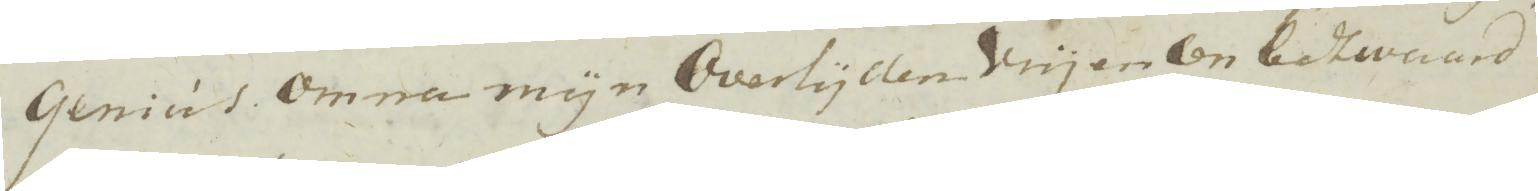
Genius Om na mijn Overlijden vrij en onbezwaard
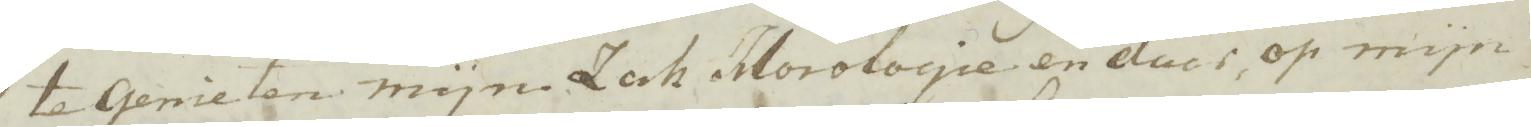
te genieten mijn zak Horologie en daar, op mijn
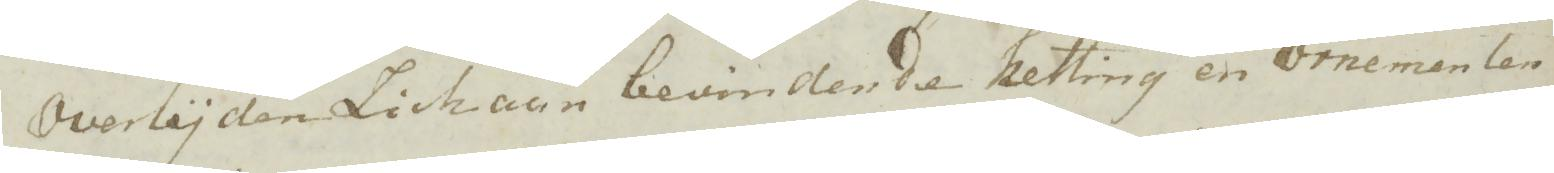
overlijden Zich aan bevindende ketting en Ornementen
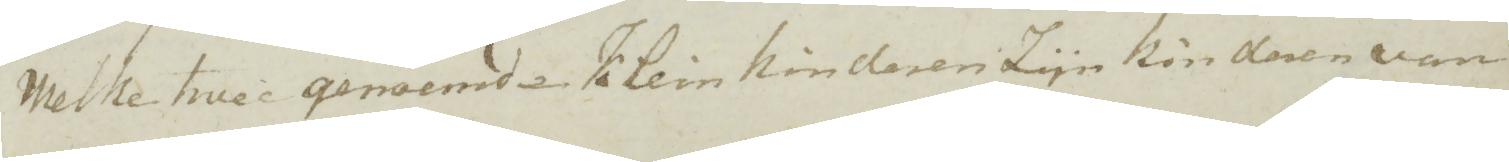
welke twee genoemde Klein kinderen Zijn kinderen van
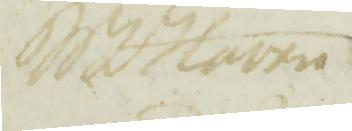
WZ Hoven
